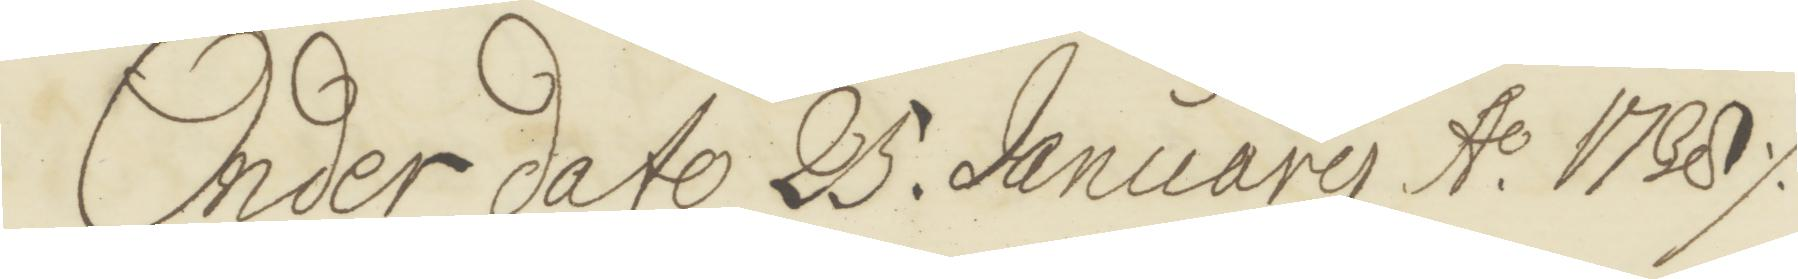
Van Siam Onder dato 25. Ianuarij A.o 1738./.
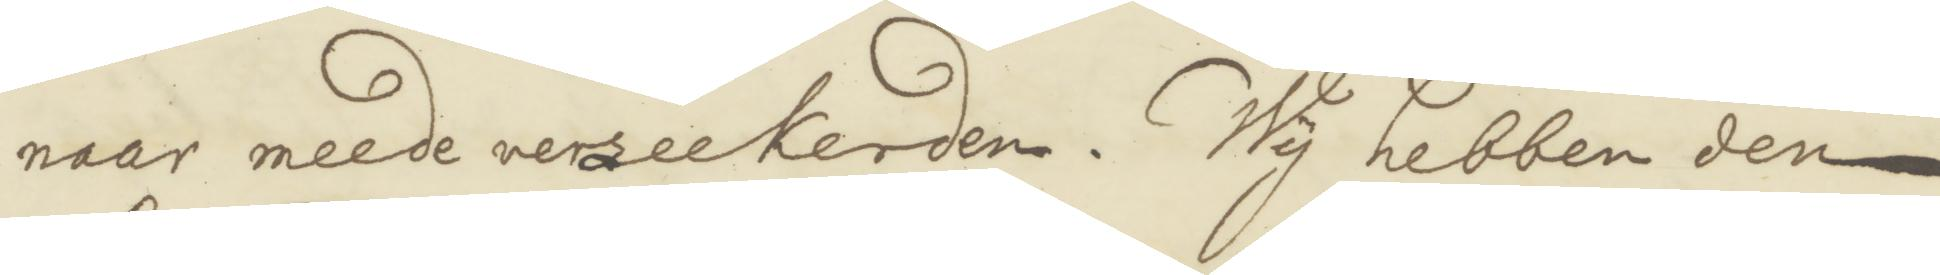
naar meede verzeekerden. Wij hebben den
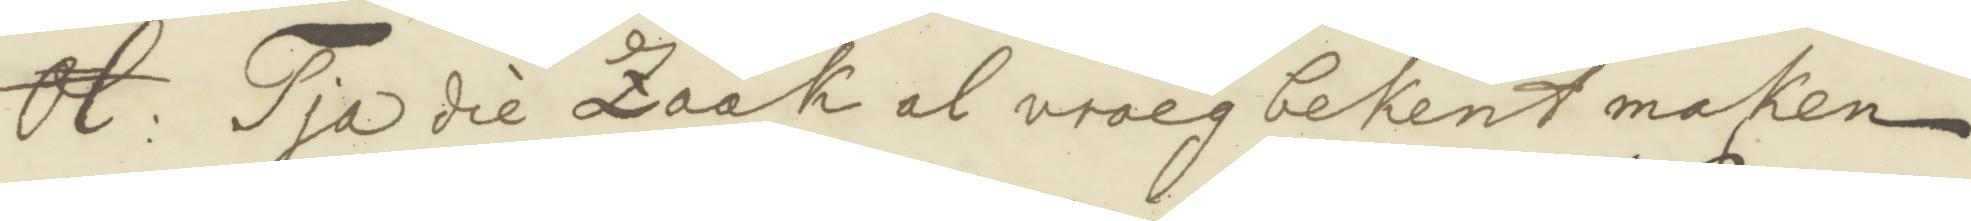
Ol: Tja die Zaak al vroeg bekent maken
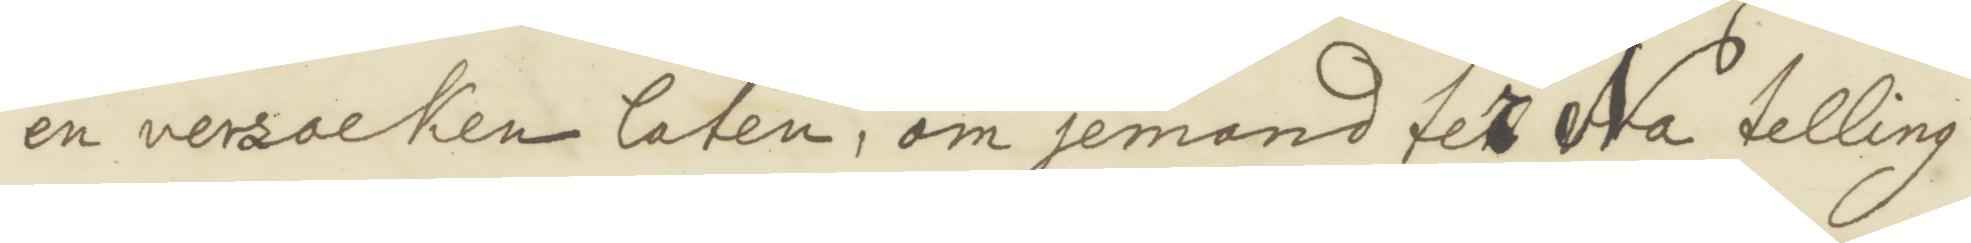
en verzoeken laten, om jemand ter Na telling
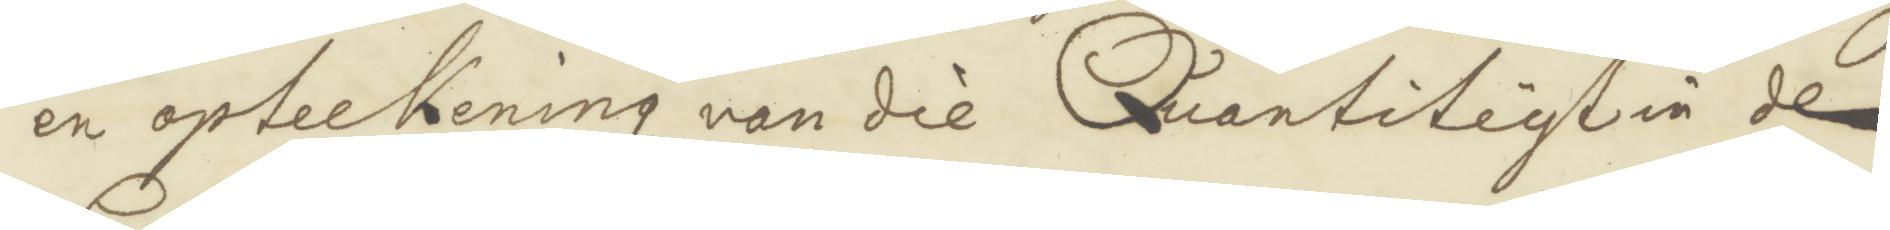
en opteekening van die Quantiteijt in de
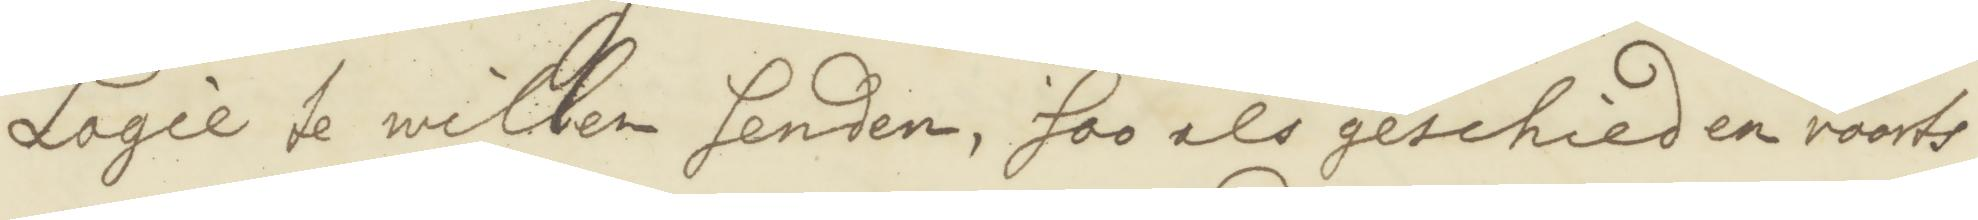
Logie te willen senden, soo als geschied en voorts
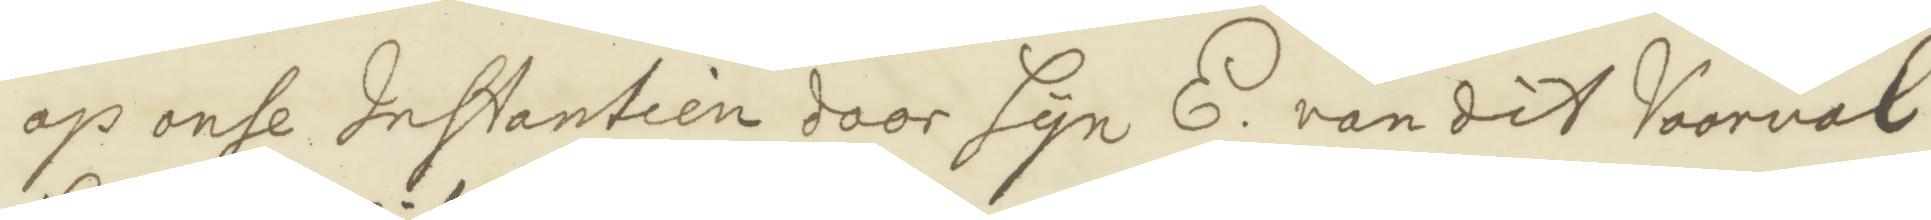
op onse Instantien door sijn E. van dit Voorval
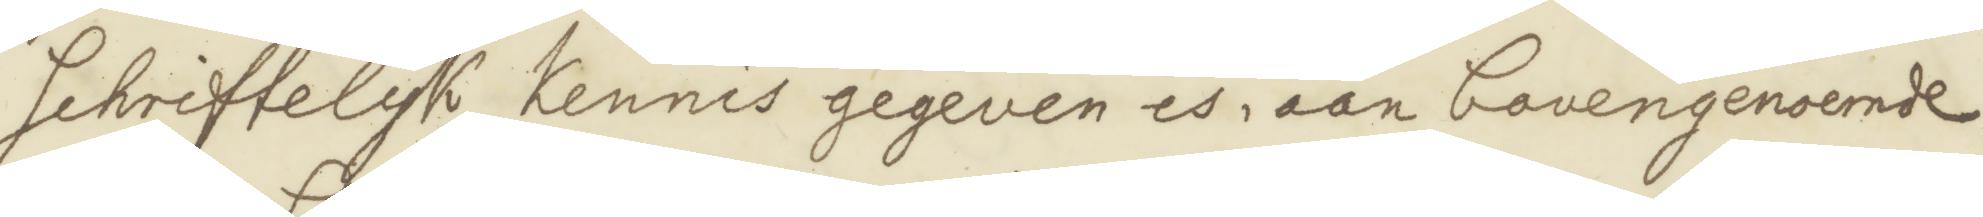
schriftelijk kennis gegeven is, aan bovengenoemde
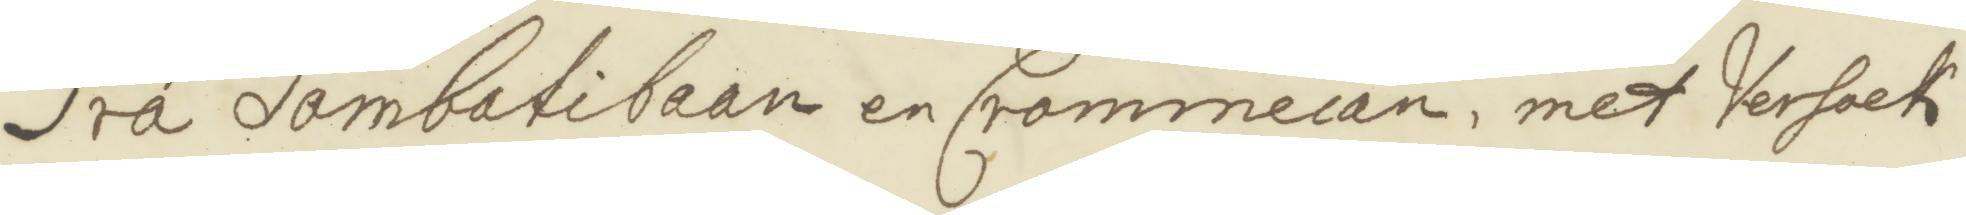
Pra Sombatibaan en Crommecan, met versoek
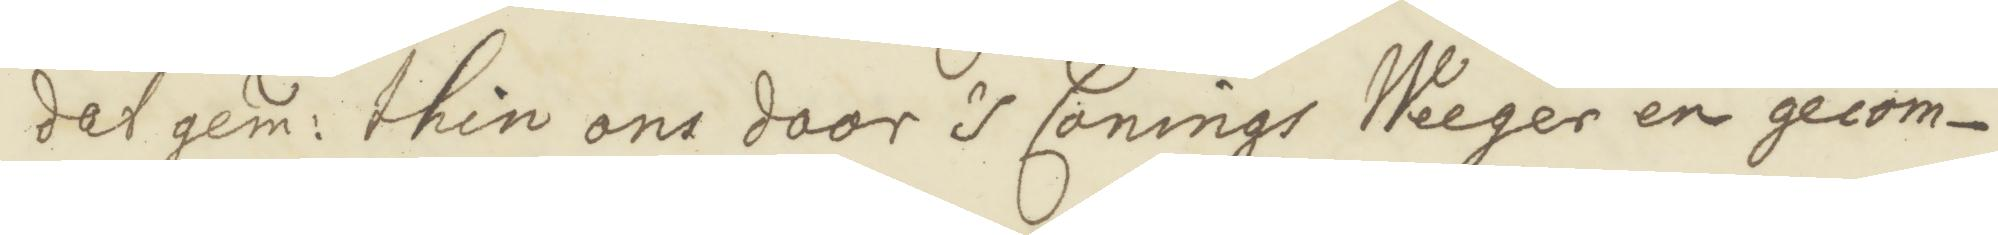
des gem: thin ons door 's Conings Weeger en gecom–
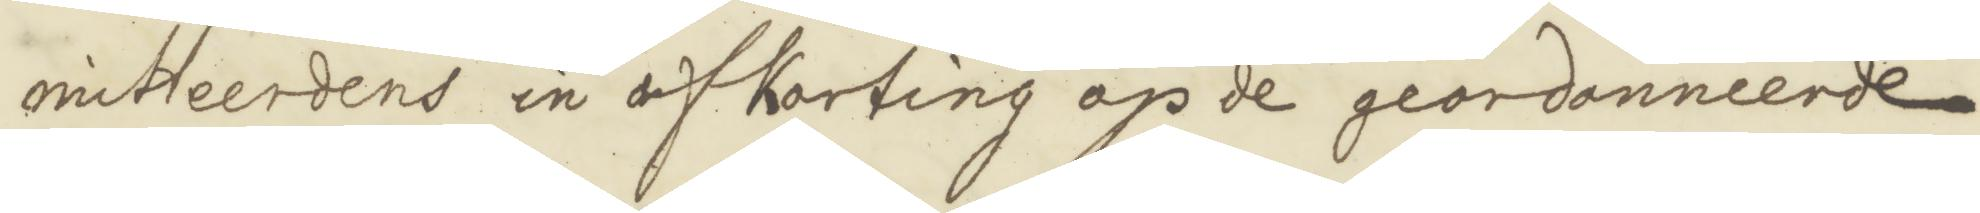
mitteerdens in afkorting op de geordonneerde
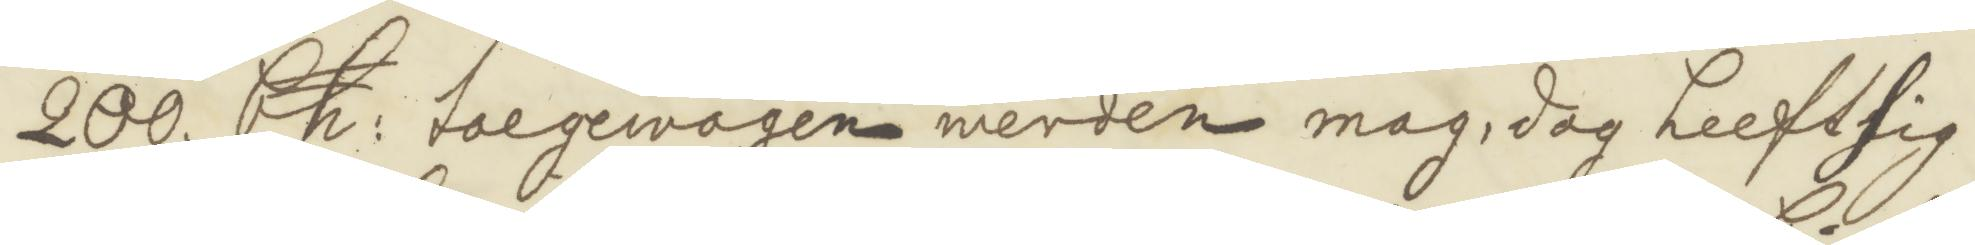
200. bh: toegewogen werden mag, dog heeft sig
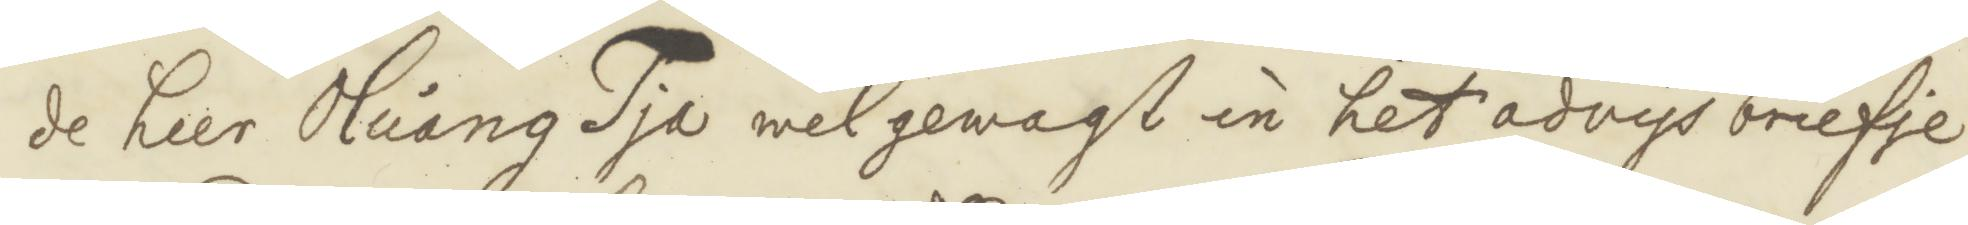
de hier Oluang Tja wel gewagt in het advijs briefje
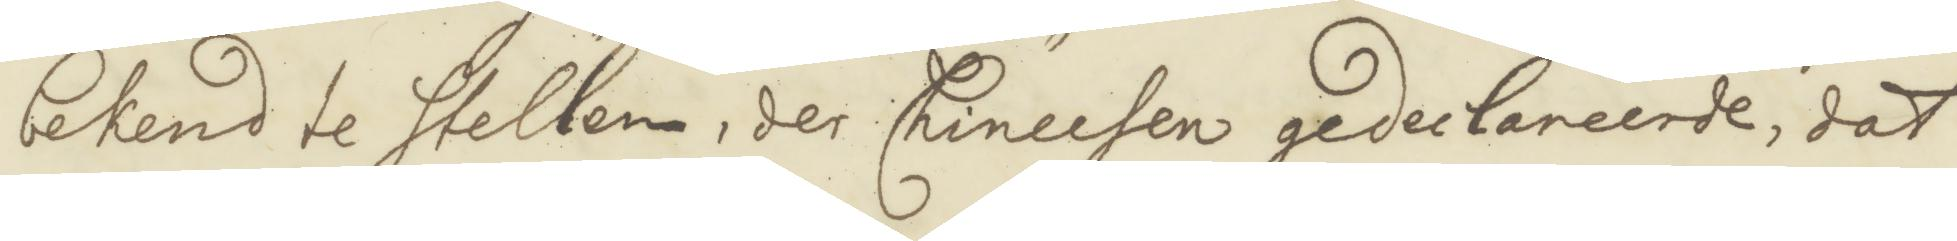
bekend te stellen, der Cineesen gedeclareerde, dat
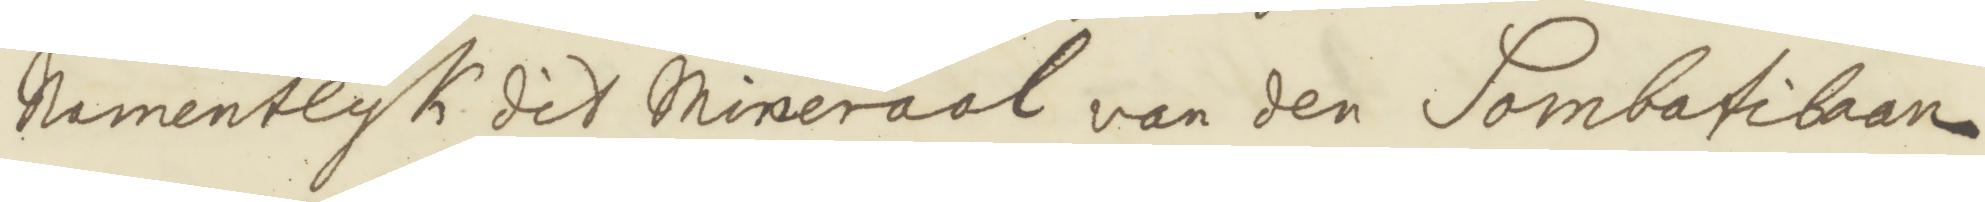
namentlijk dit mineraal van den Sombatibaan
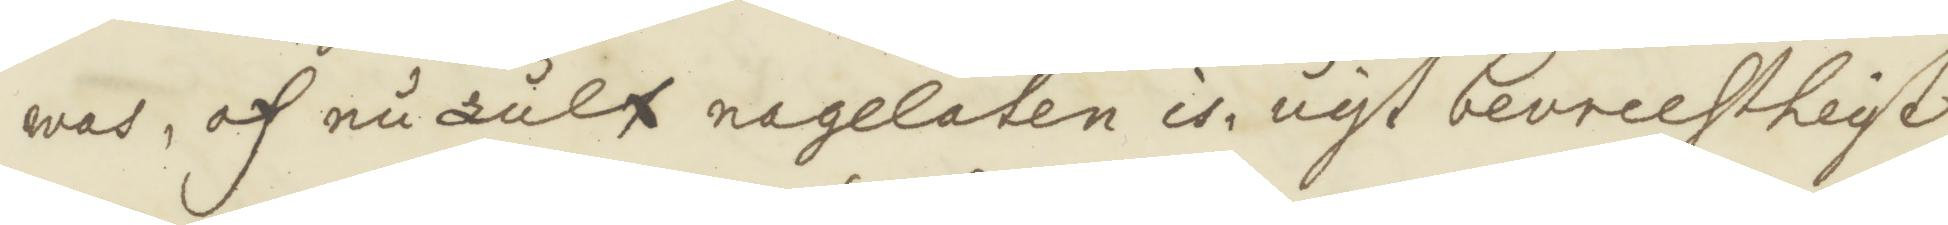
was, of nu zulx nagelaten is, uijt bevreestheijt
